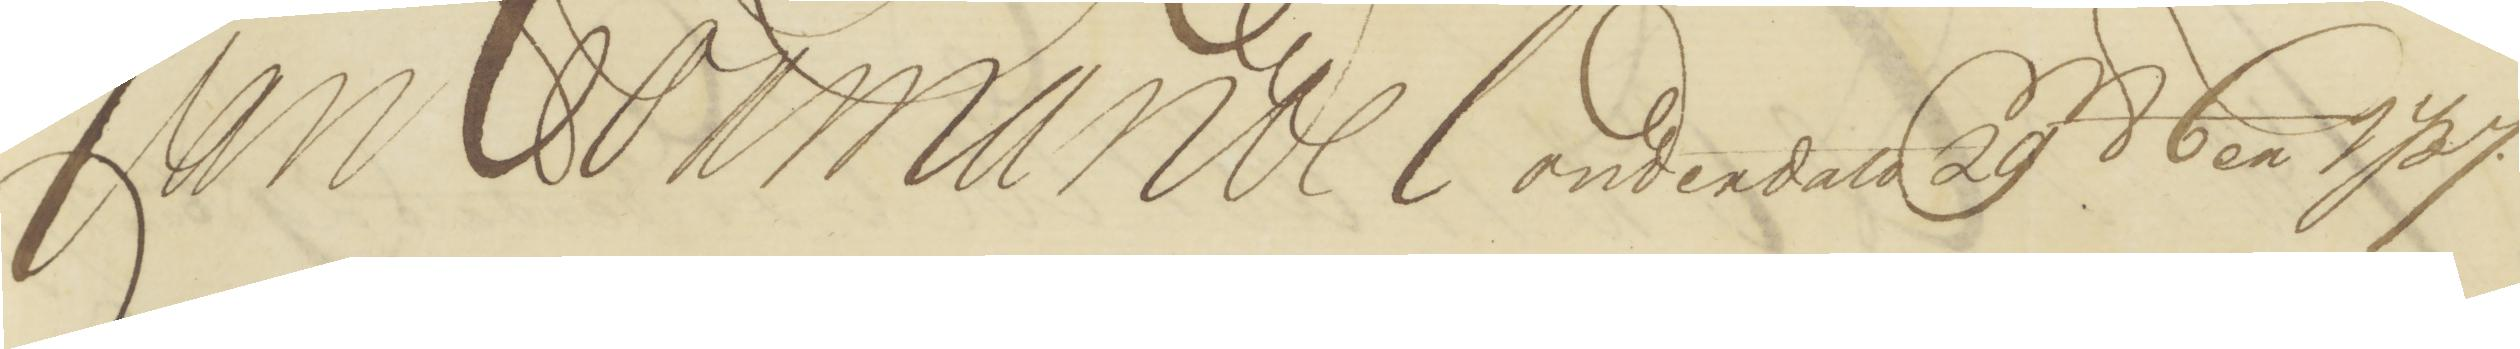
Van Cormandel onder dato 29 8ber 1737.
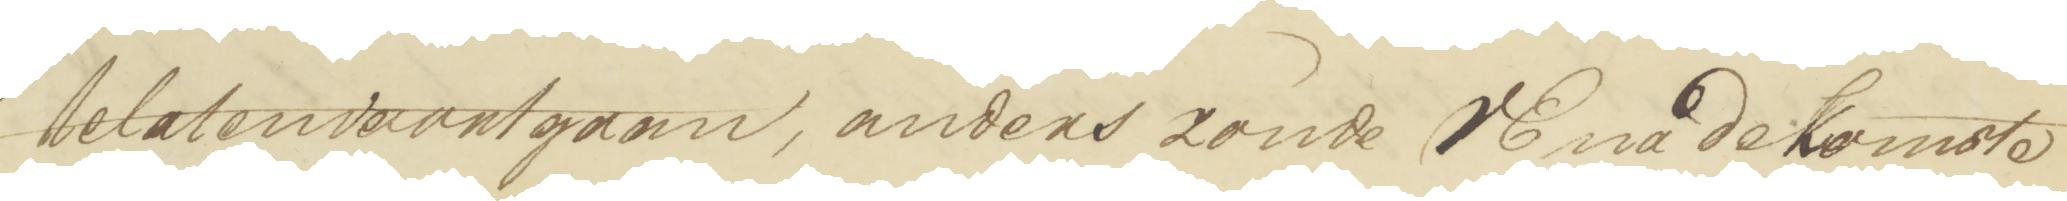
te laten voortgaan, anders zoude VE na de komste
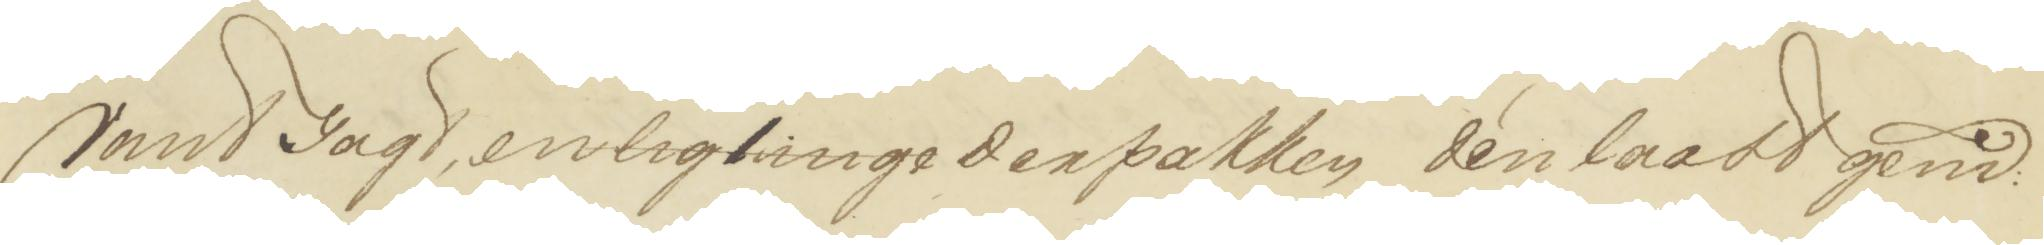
vant Iagt, en ligtinge der pakken den laast gem:
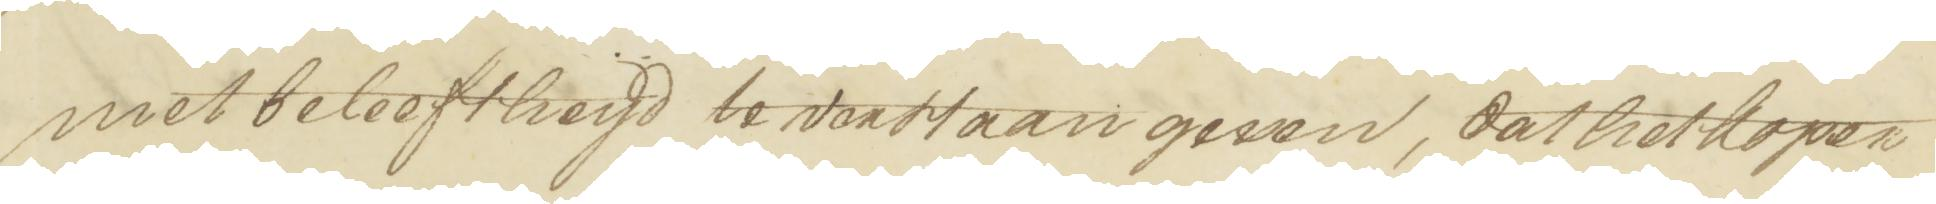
met beleeftheijd te verstaan geven, dat het koper
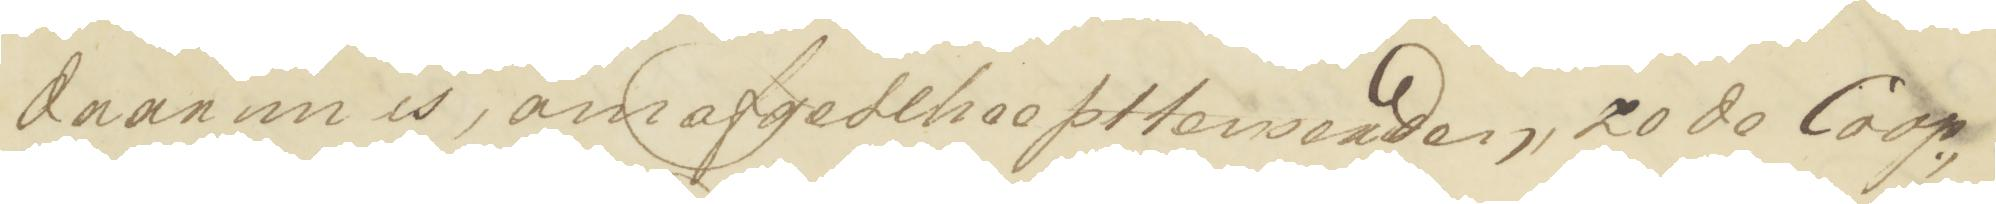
daar in is, om afgescheept te werden, zo de Coop„
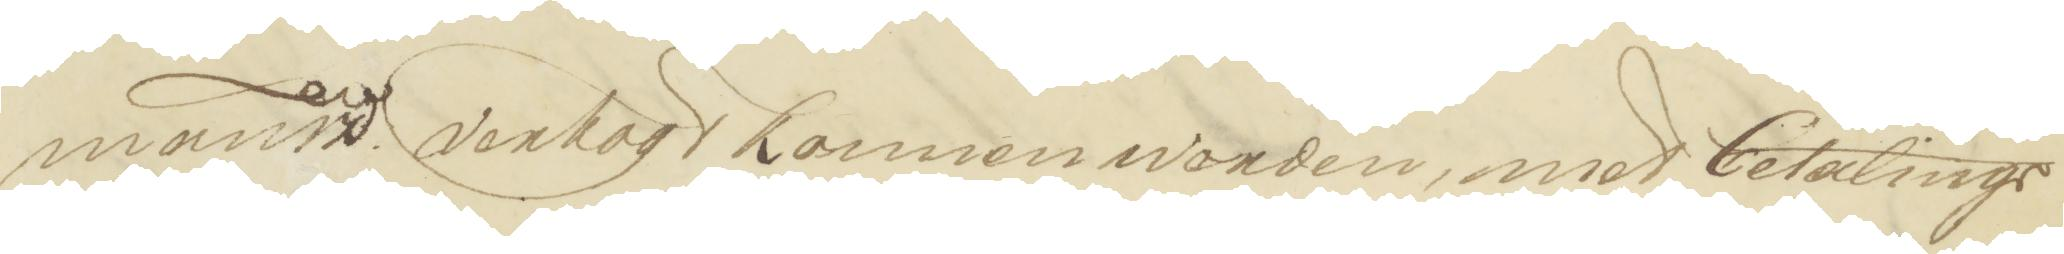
mansz: verkogt konnen worden, met betalings
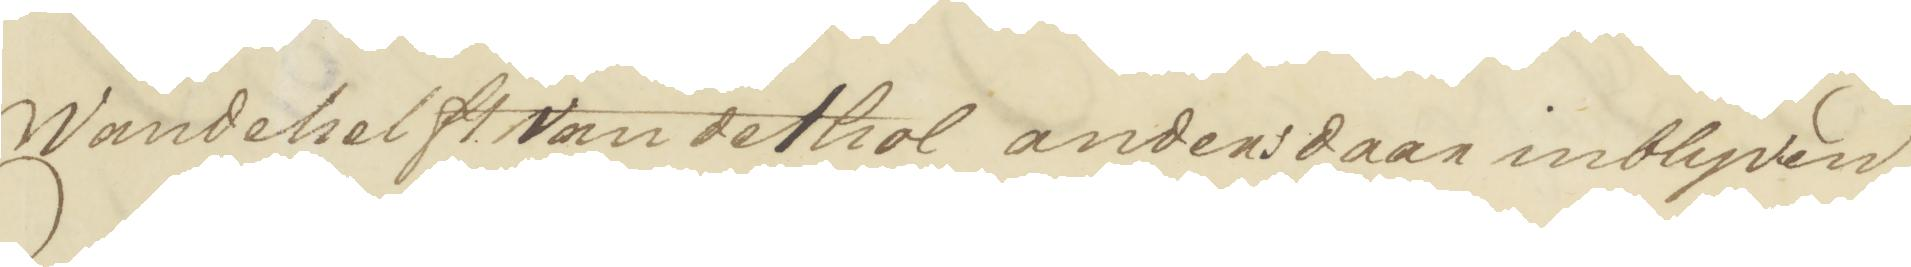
van de helft van de thol anders daar in blyven
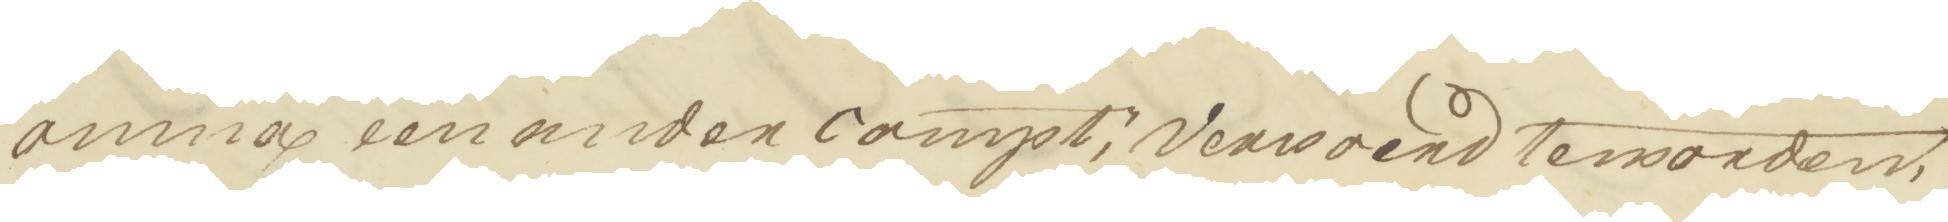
om na een ander compt: vervoerd te worden,
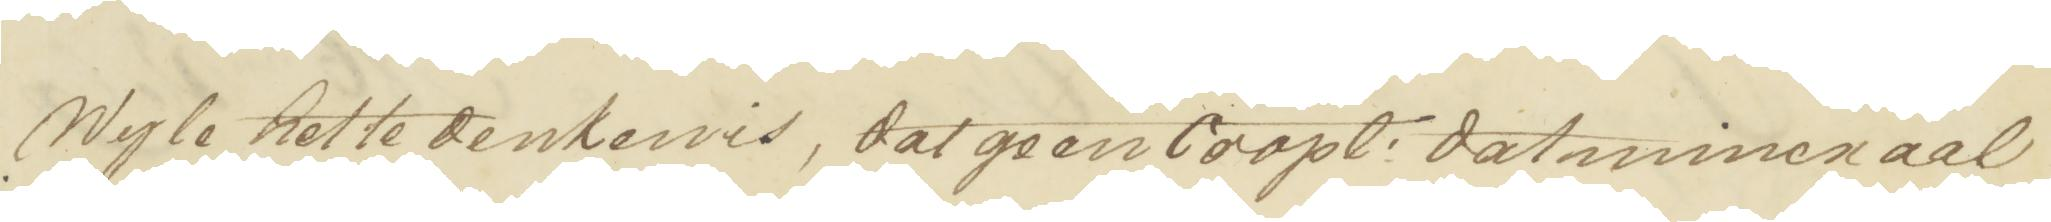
wyle het te denken is, dat geen coopl: dat mineraal
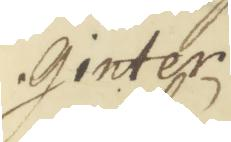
.ginter
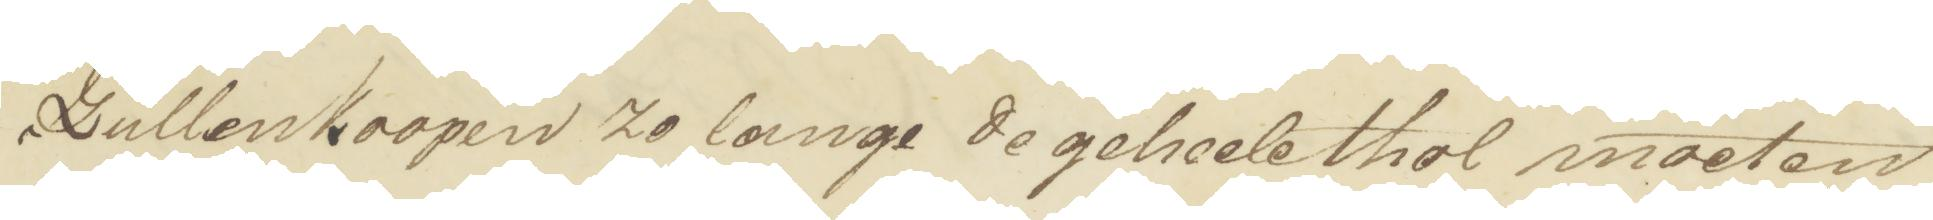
zullen koopen zo lange de geheele thol moeten
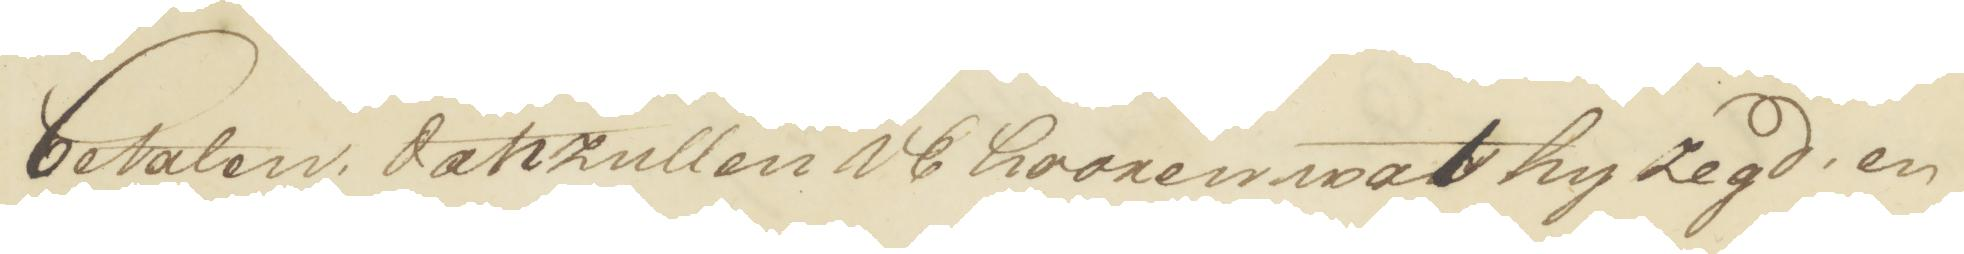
betalen, dan zullen VE hooren wat hy zegd en
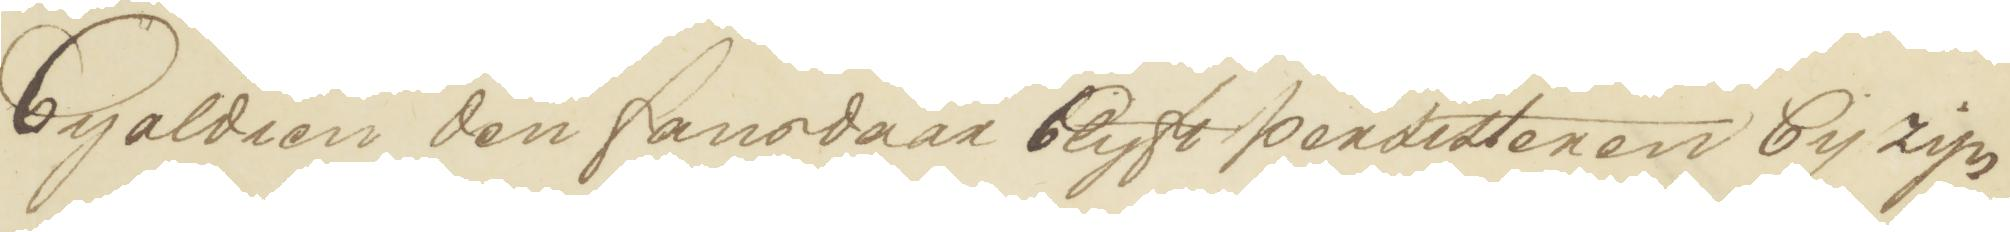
by aldien den fausdaar blijft persisteren bij zijn
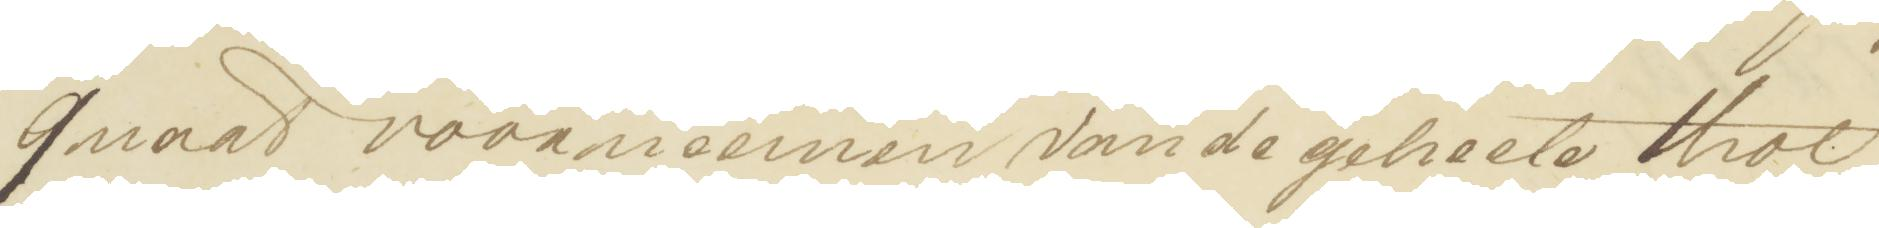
quaat voorneemen van de geheele thol
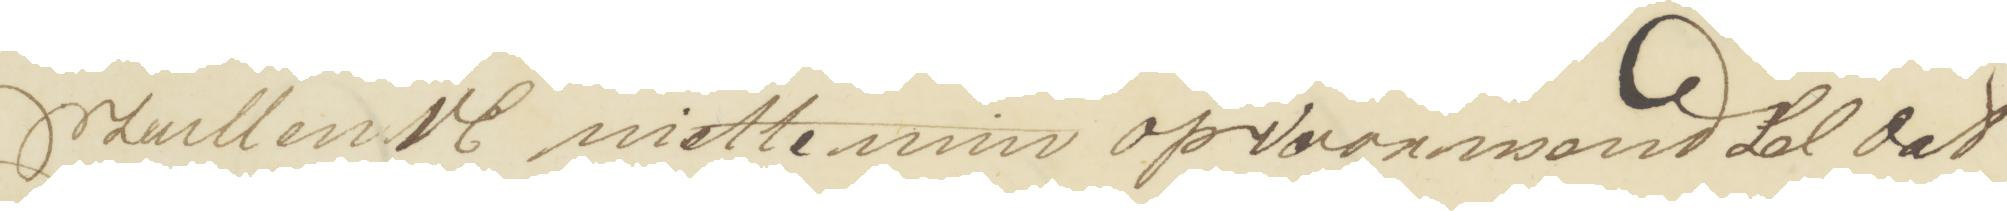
zullen VE niet te min op voorwendsel dat
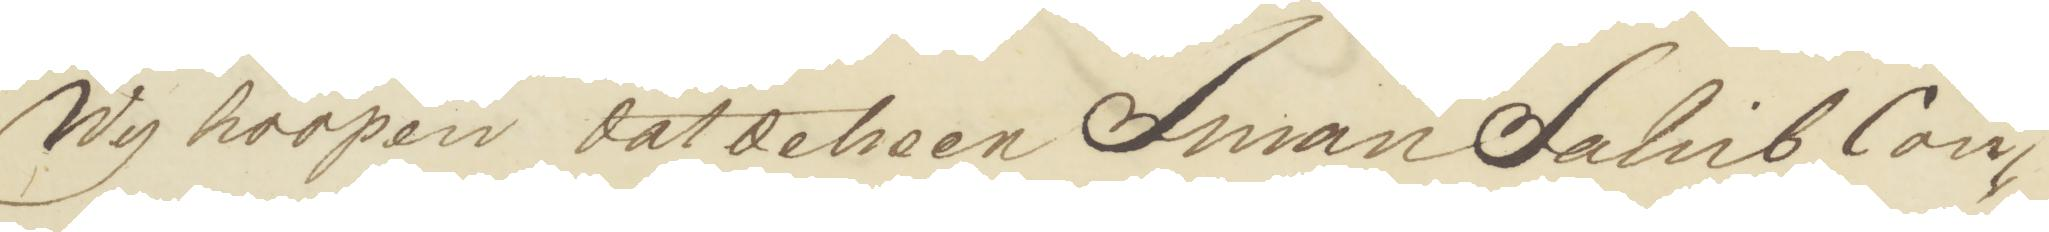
wij hoopen dat de heer Iman Sahib Con„
